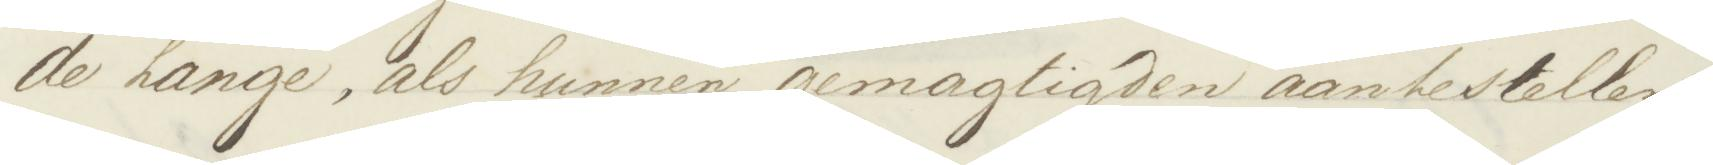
de Lange, als hunnen gemagtigden aantestellen
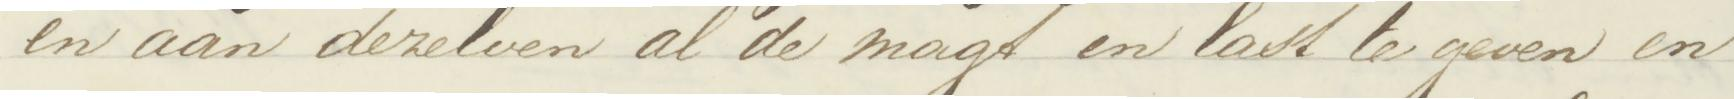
en aan dezelven al de magt en last te geven en
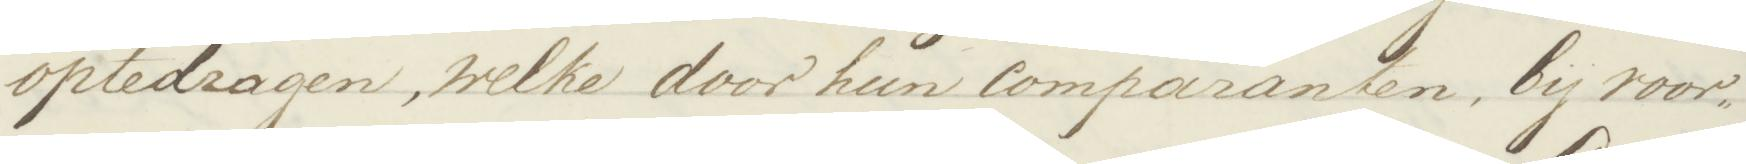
optedragen, welke door hun comparanten, bij voor„
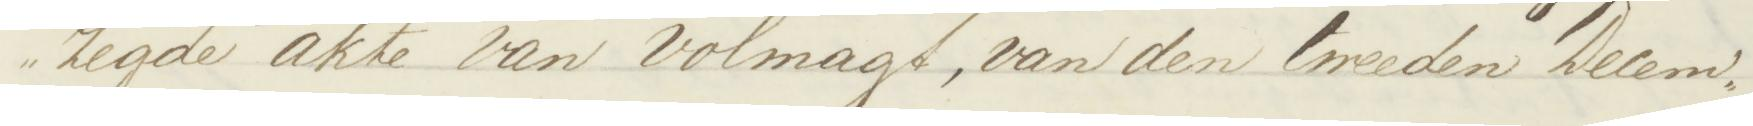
„zegde akte van volmagt, van den tweeden Decem„
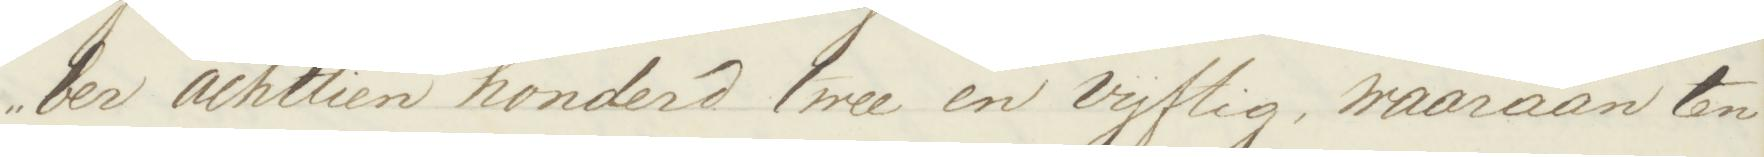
„ber achttien honderd twee en vijftig, waaraan ten
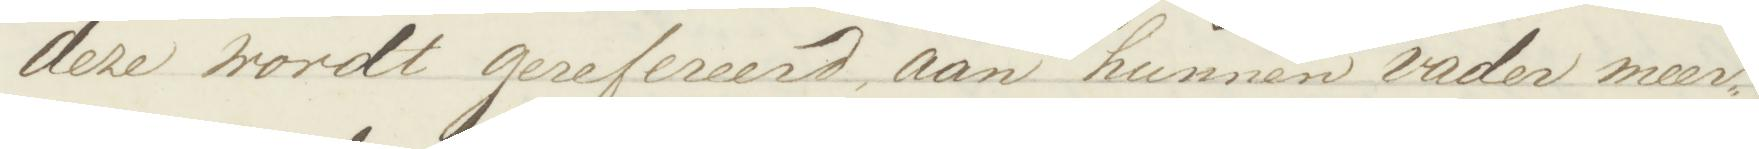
deze wordt gerefereerd, aan hunnen vader meer„
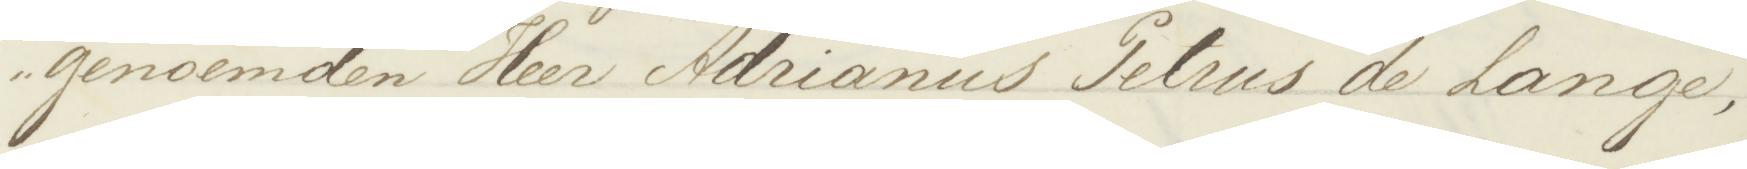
„genoemden Heer Adrianus Petrus de Lange,
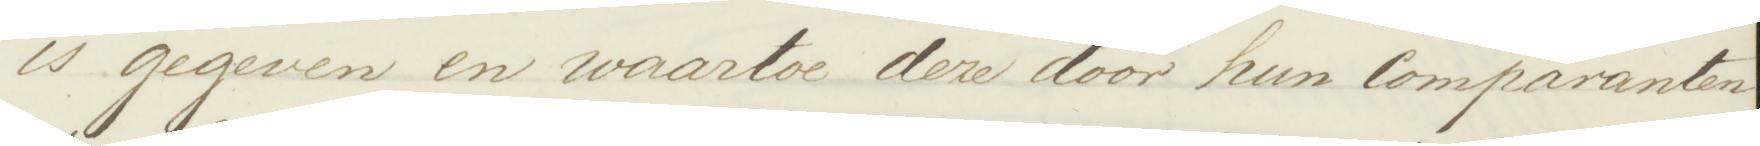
is gegeven en waartoe deze door hun Comparanten
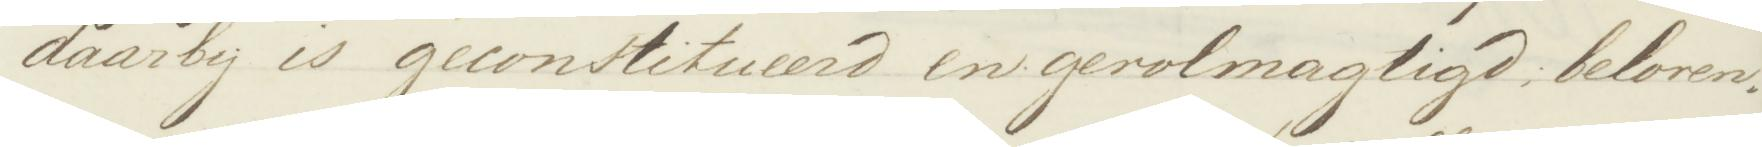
daarbij is geconstitueerd en gevolmagtigd; beloven„
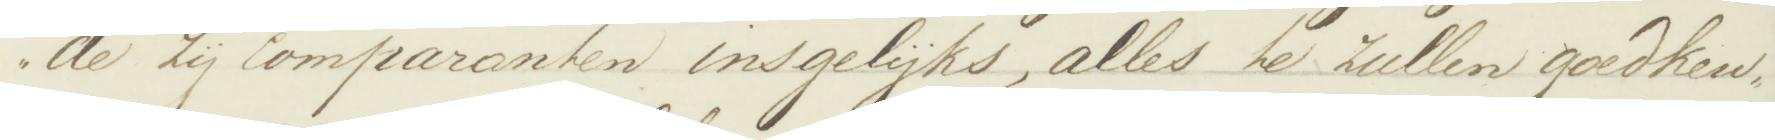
„de zij Comparanten insgelijks, alles te zullen goedkeu„
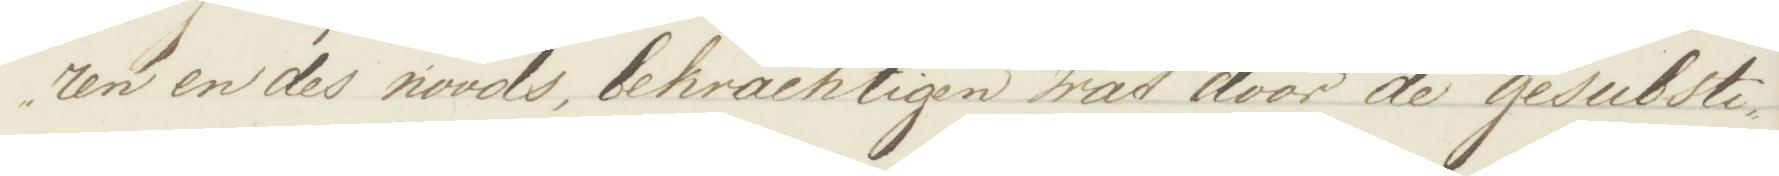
„ren en des noods, bekrachtigen wat door de gesubsti„
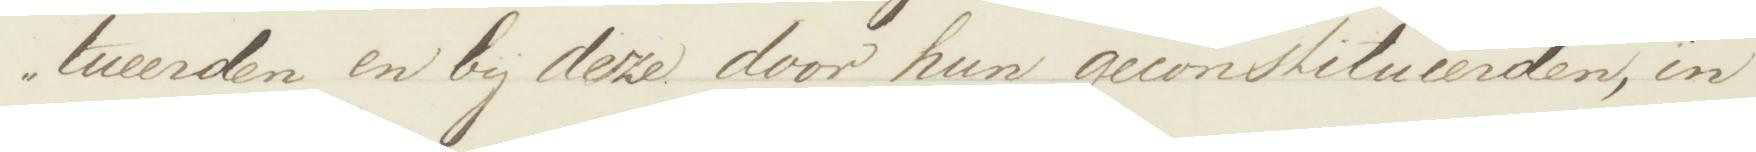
„tueerden en bij deze door hun geconstitueerden, in
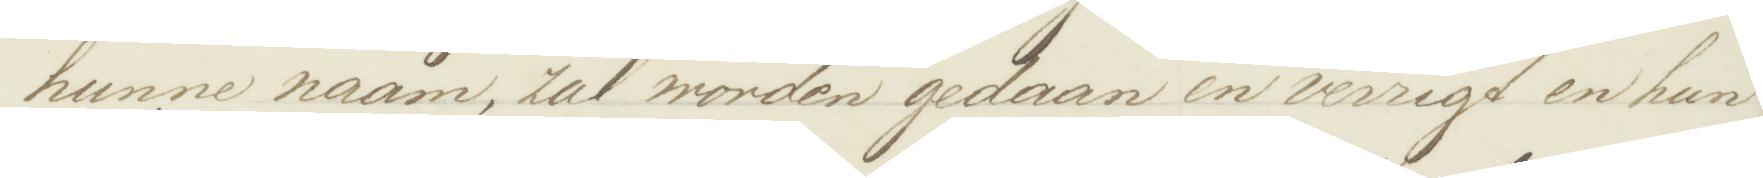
hunne naam, zal worden gedaan en verrigt en hun
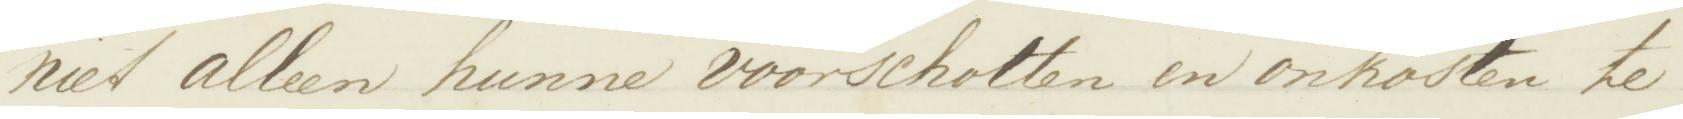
niet alleen hunne voorschotten en onkosten te
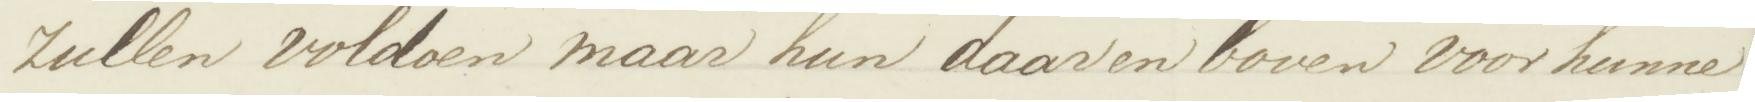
zullen voldoen maar hun daar en boven voor hunne
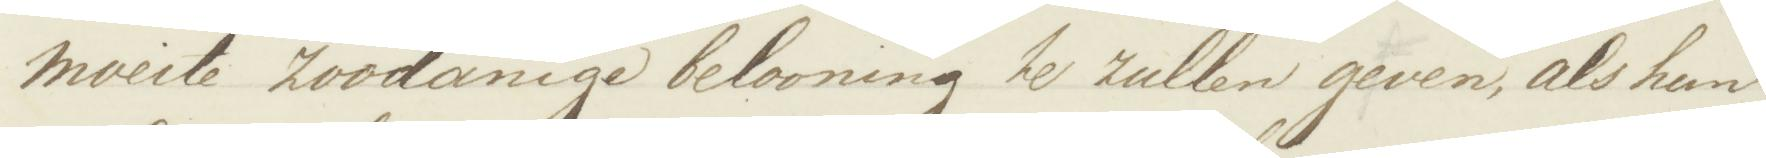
moeite zoodanige belooning te zullen geven, als hun
